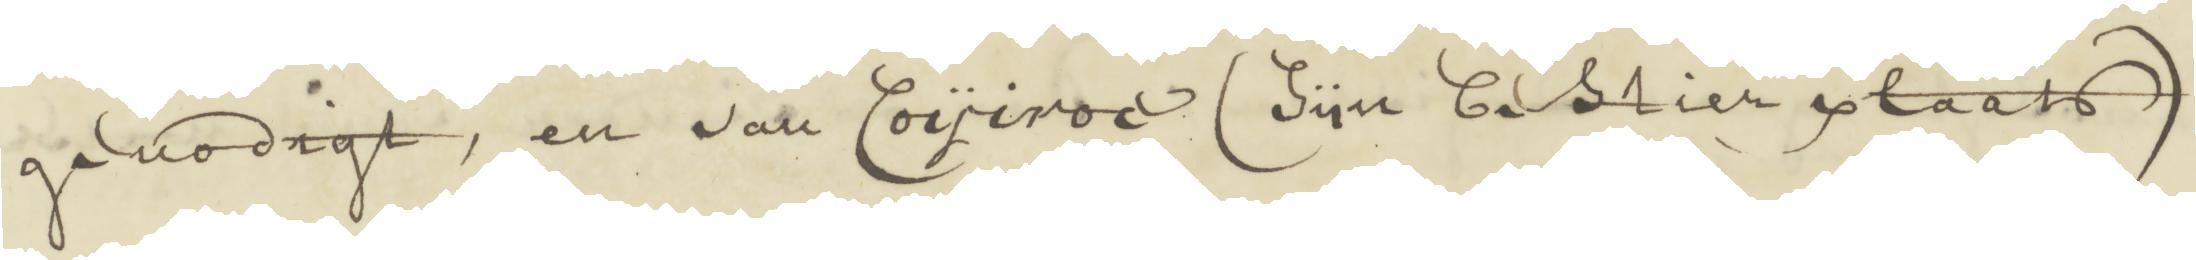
genodigt, en van Coijiroe (sijn bestier plaats)
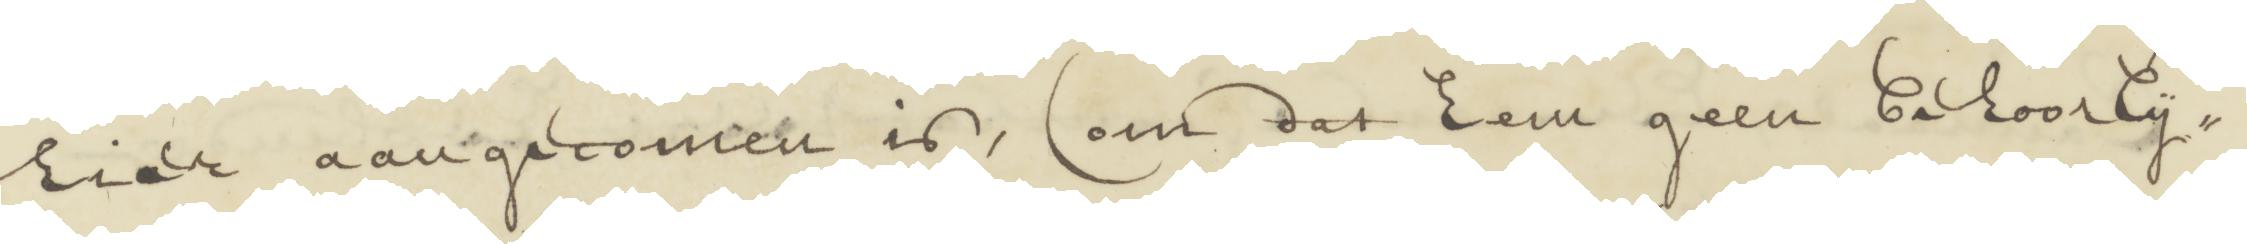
hier aangecomen is, (om dat hem geen behoorlij„
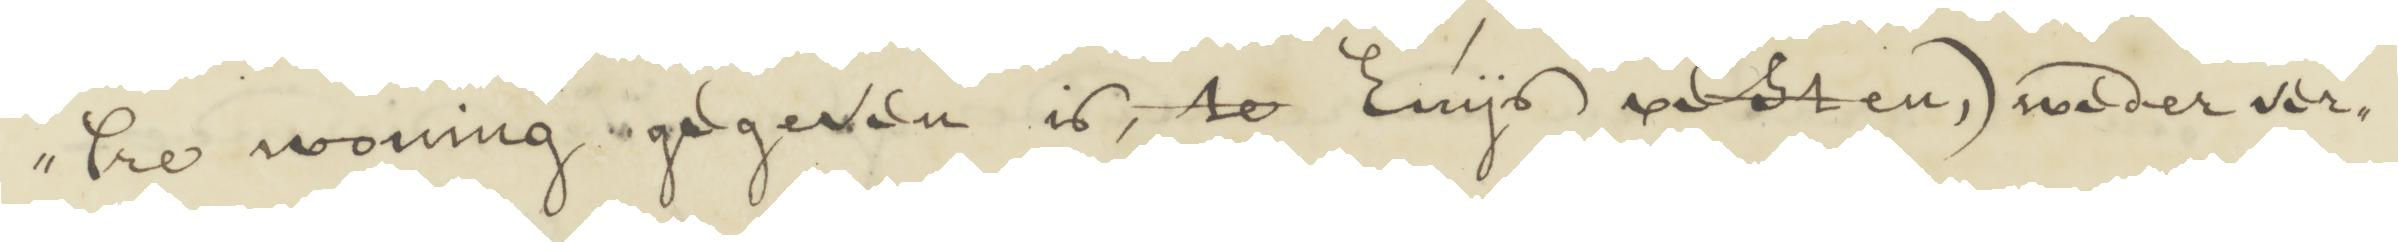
„ke woning gegeven is, te huijs vesten,) weder ver„
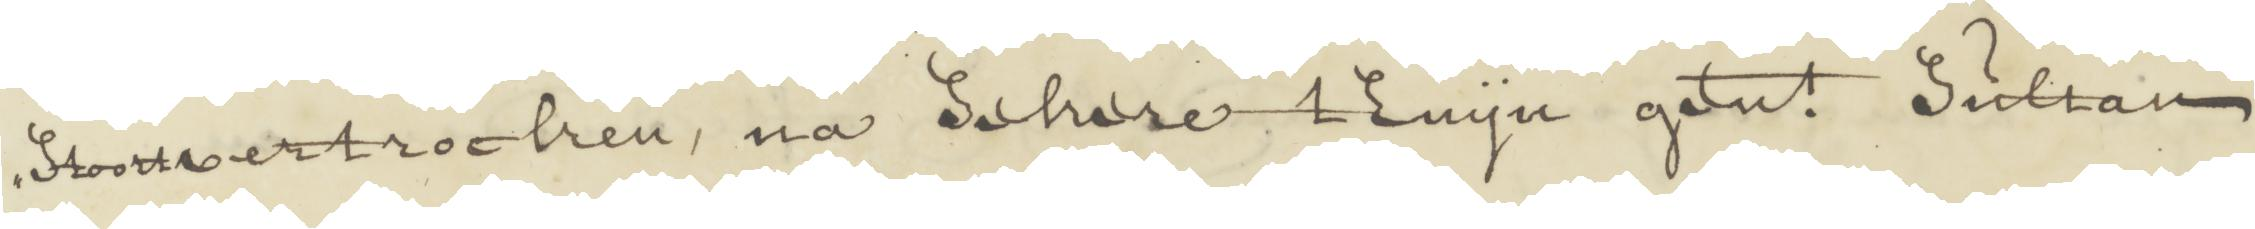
„stoort vertrocken, na sekere thuijn gen.t sultan
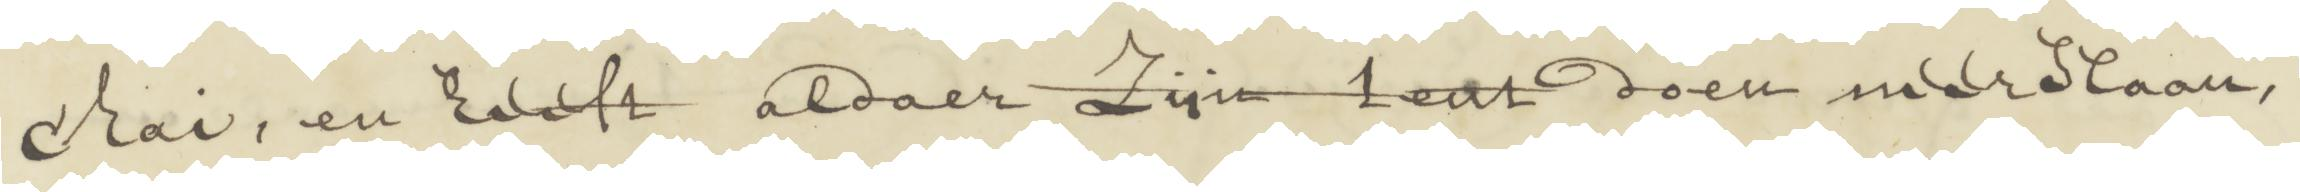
chai, en heeft aldaer zijn tent doen neerslaan,
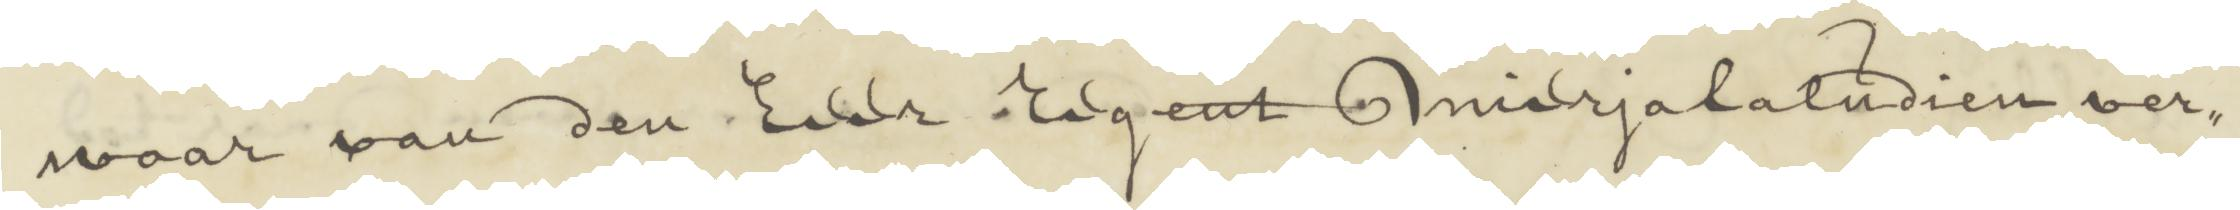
waar van den heer Regent Mierjalaludien ver„
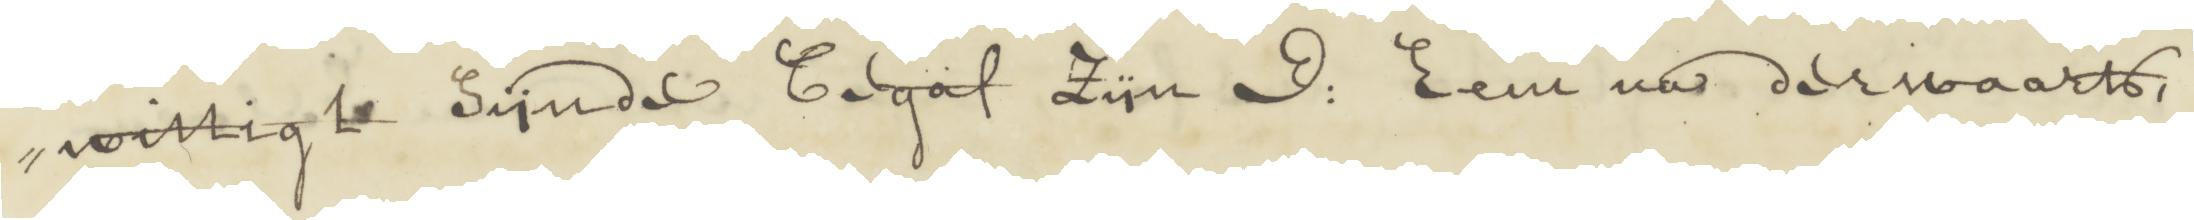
„wittigt sijnde begaf zijn E: hem na derwaarts,
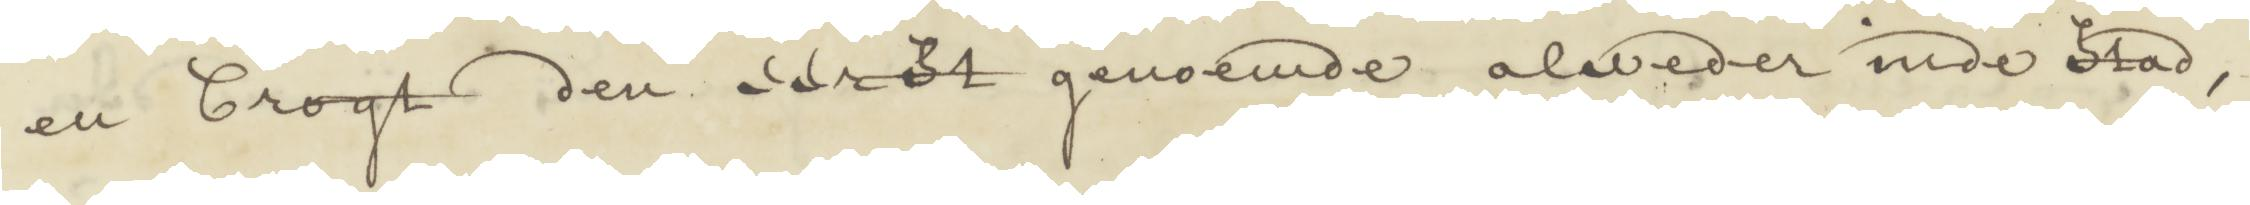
en brogt den eerst genoemde alweder inde stad,
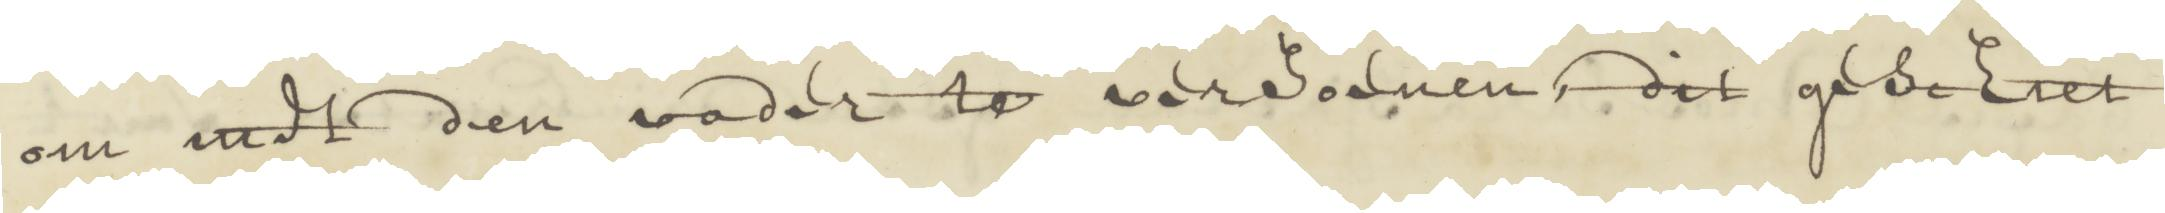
om met den vader te versoenen, dit geschiet
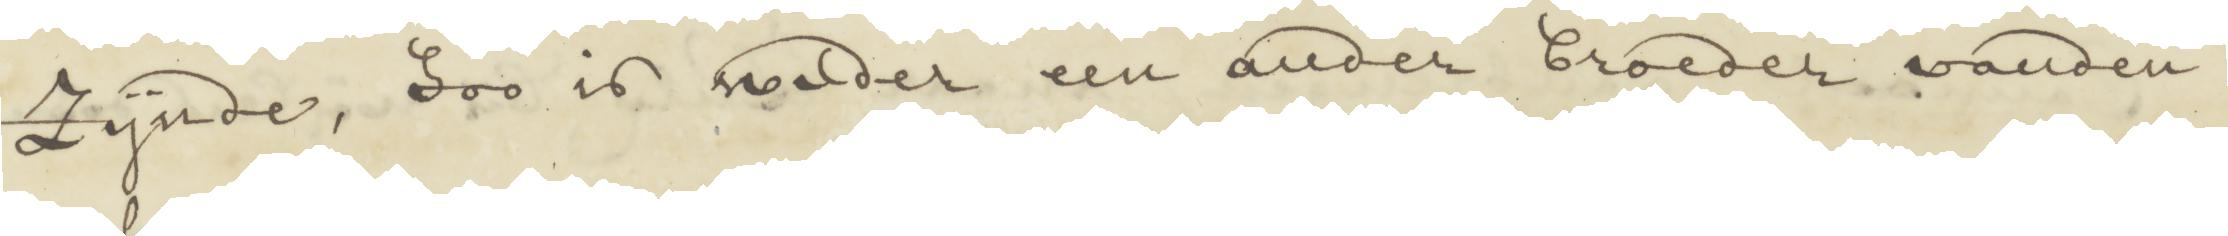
zijnde, soo is weder een ander broeder vanden
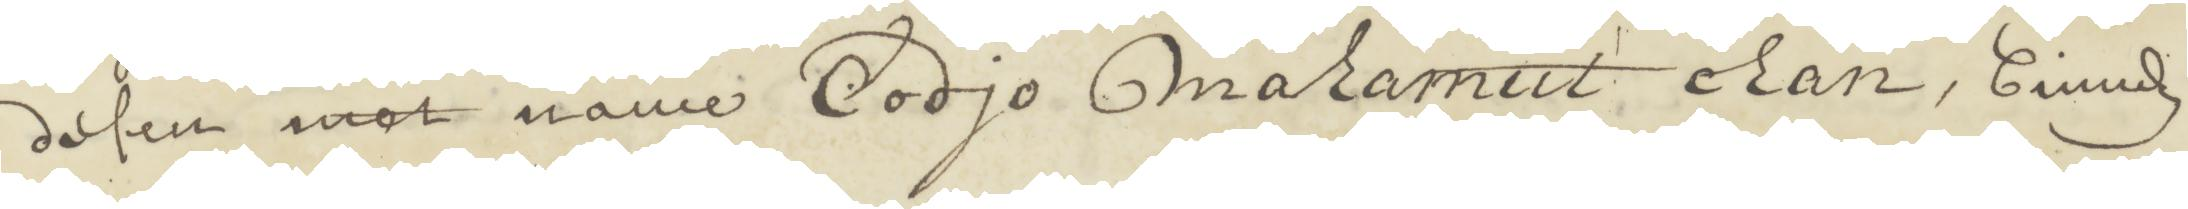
desen met name Codjo Mahamut chan, binnen
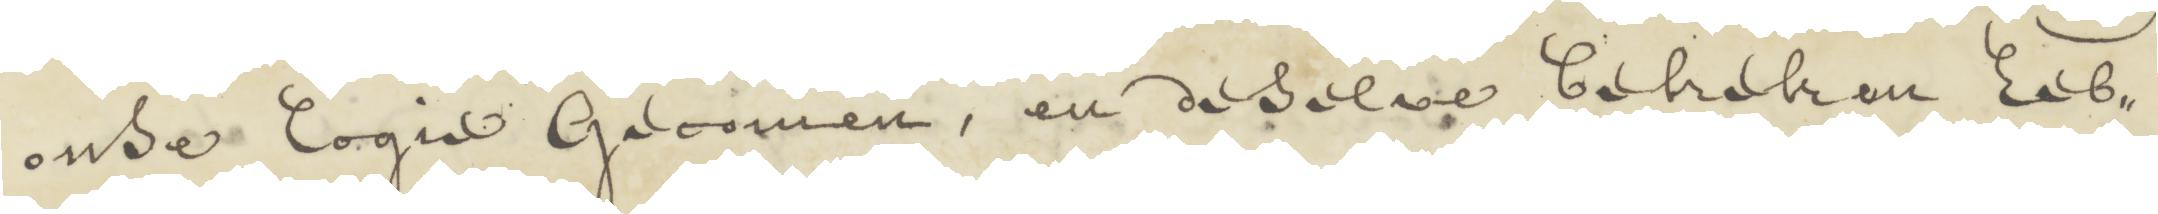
onse logie Gecomen, en deselve bekeken heb„
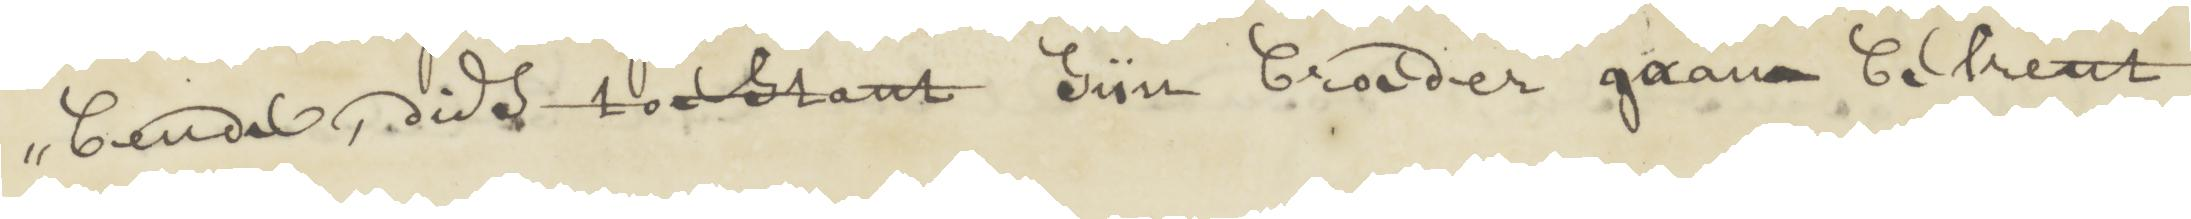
„bende, dies toestant sijn broeder gaan bekent
